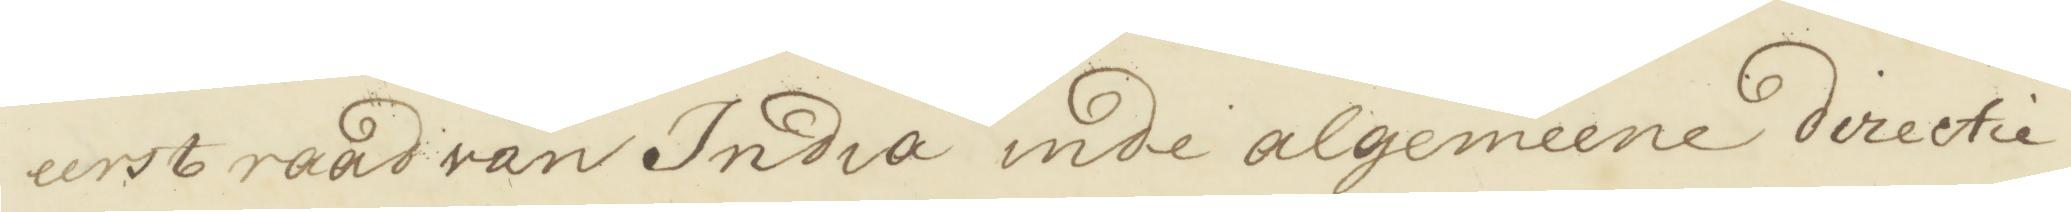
eerst raad van India inde algemeene directie
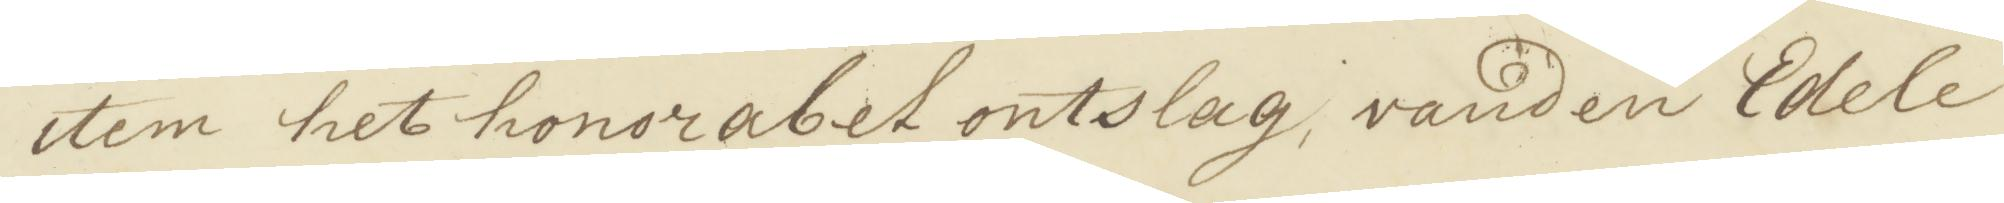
item het honorabele ontslag, vanden Edele
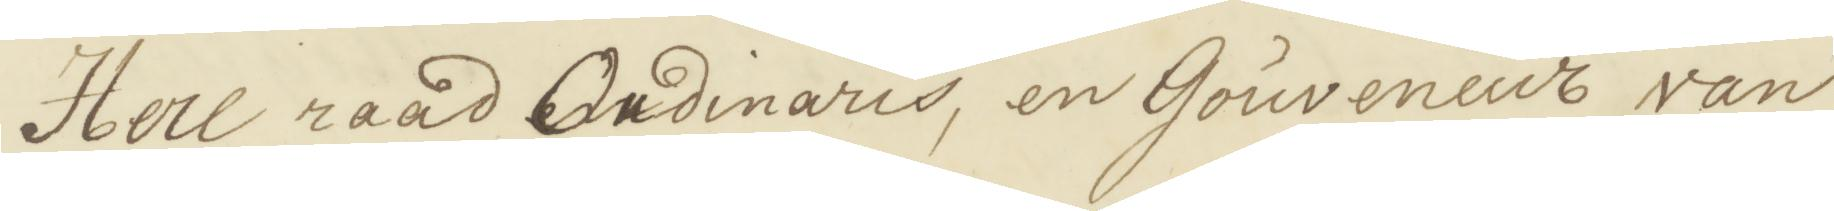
Here raad Ordinaris, en Gouveneur van
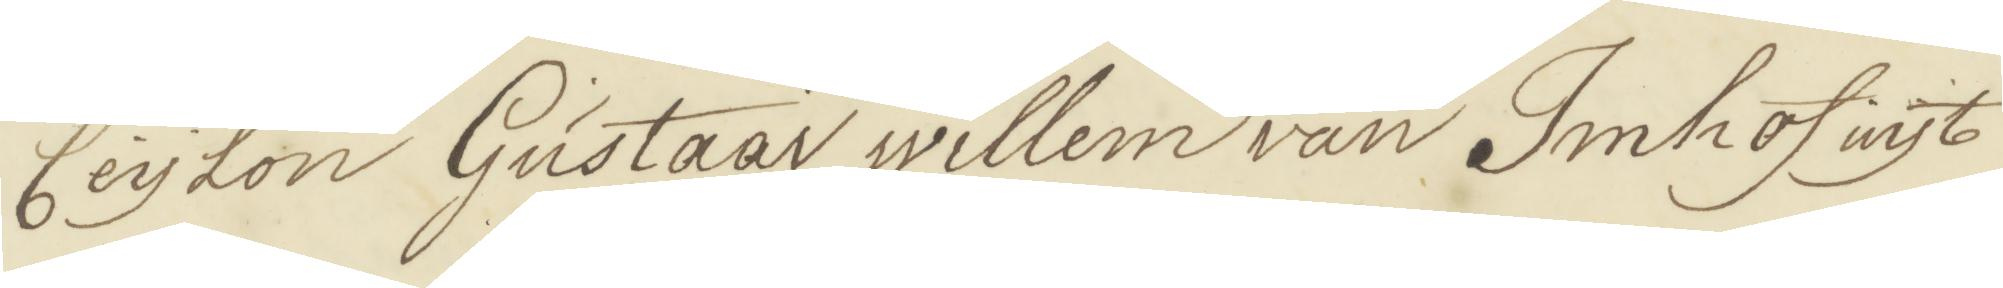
Ceijlon Gustaav willem van Imhof uijt
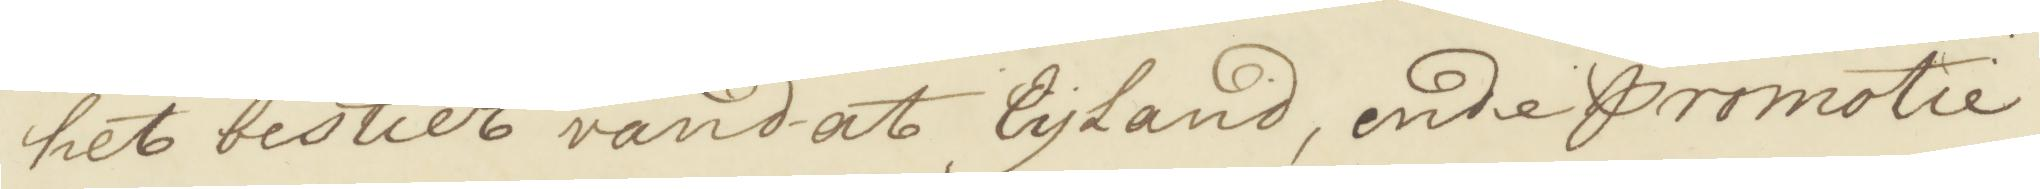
het bestier vandat Eijland, ende promotie
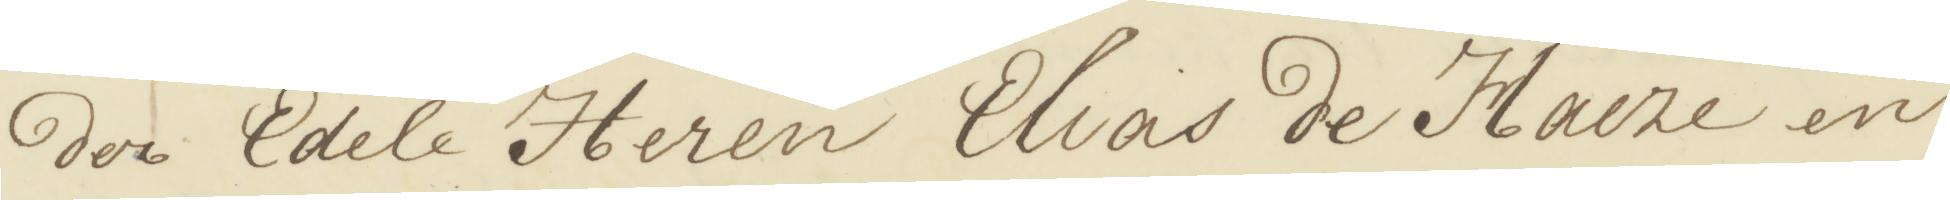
der Edele Heren Elias de Haeze en
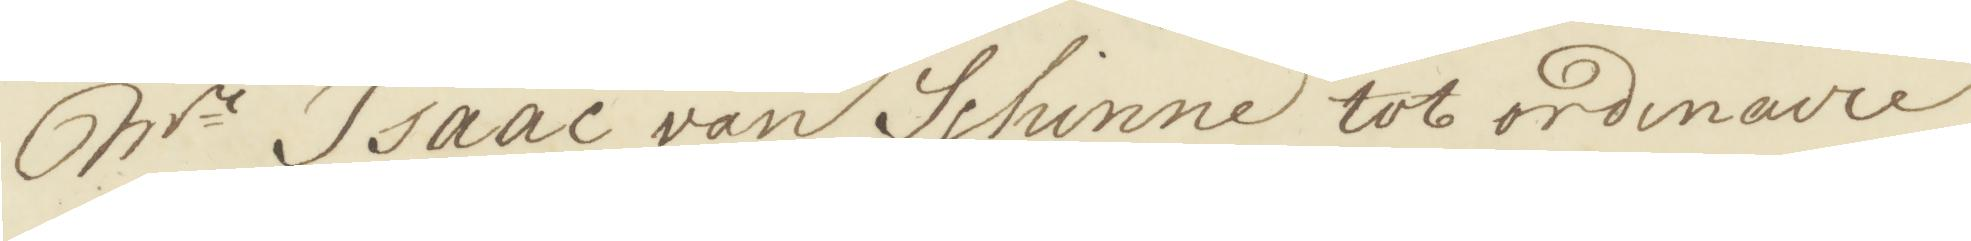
M=r Isaac van Schinne tot ordinaire
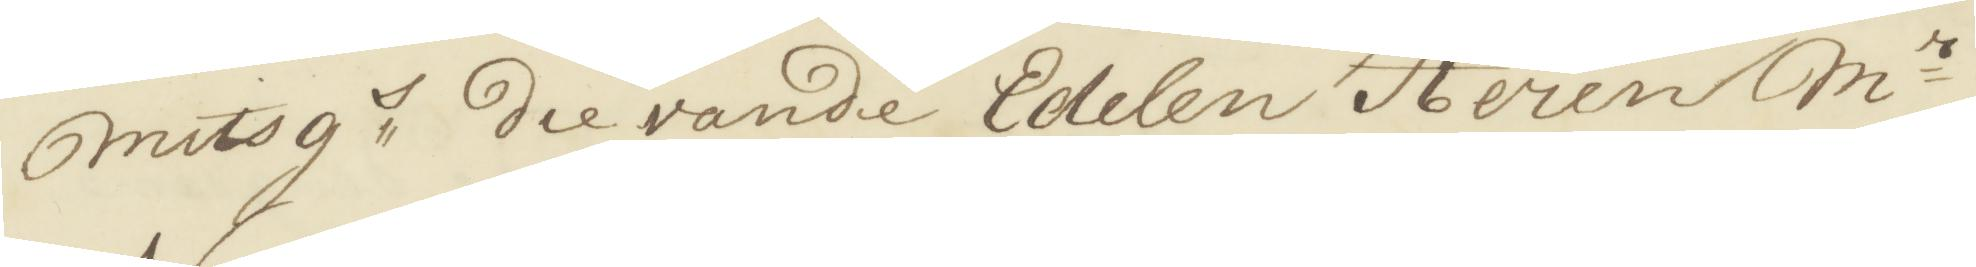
mitsg„s die vande Edelen Heren m=r
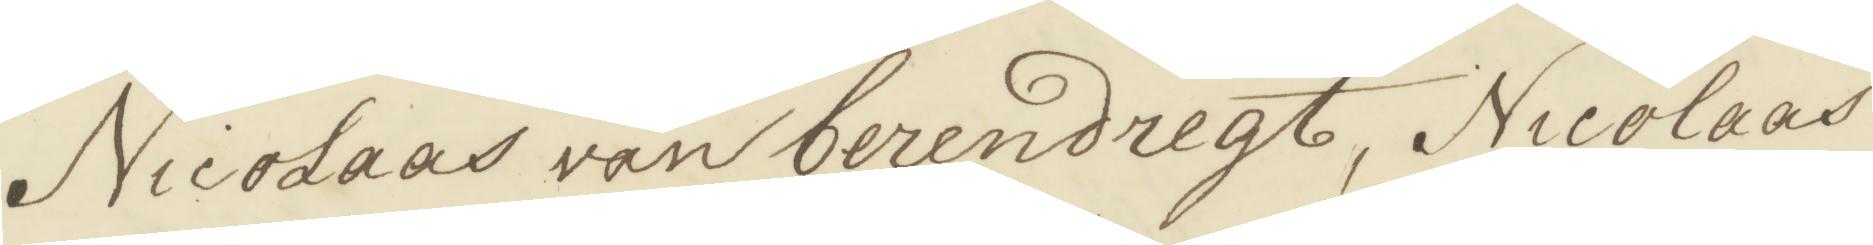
Nicolaas van berendregt, Nicolaas
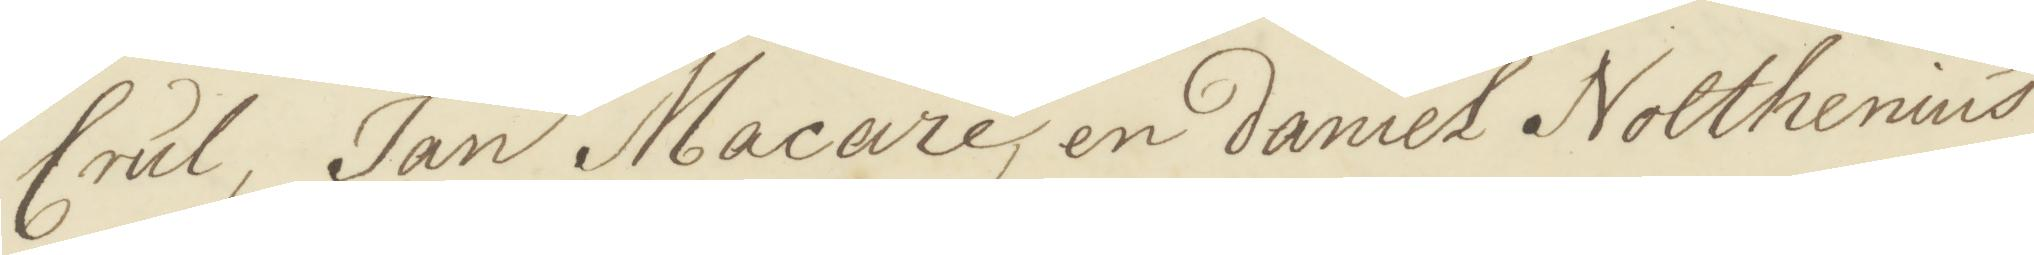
Crul, Jan Macare, en daniel Nolthenius
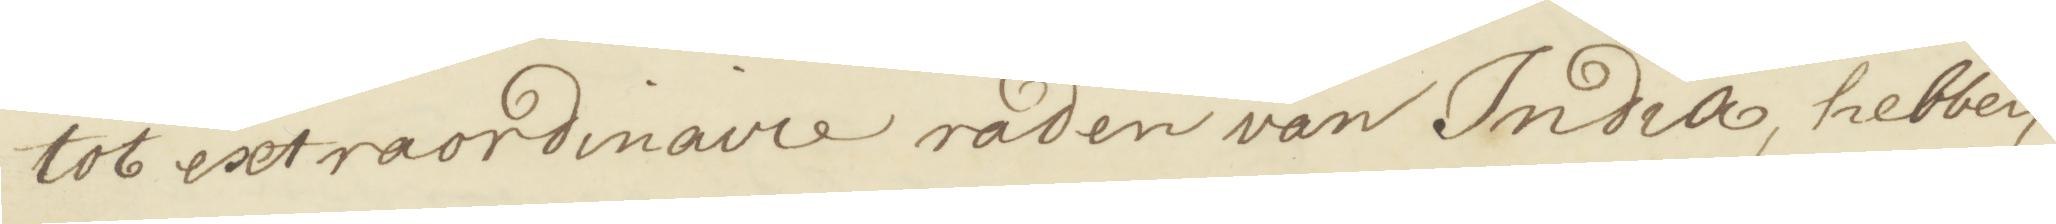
tot extraordinaire raden van India, hebben
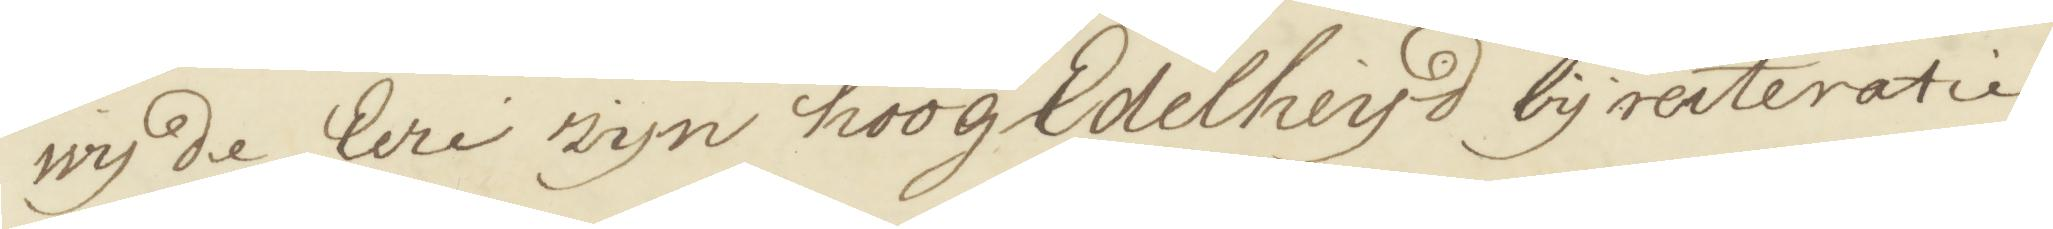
wij de Eere zijn hoog Edelheijd bij reiteratie
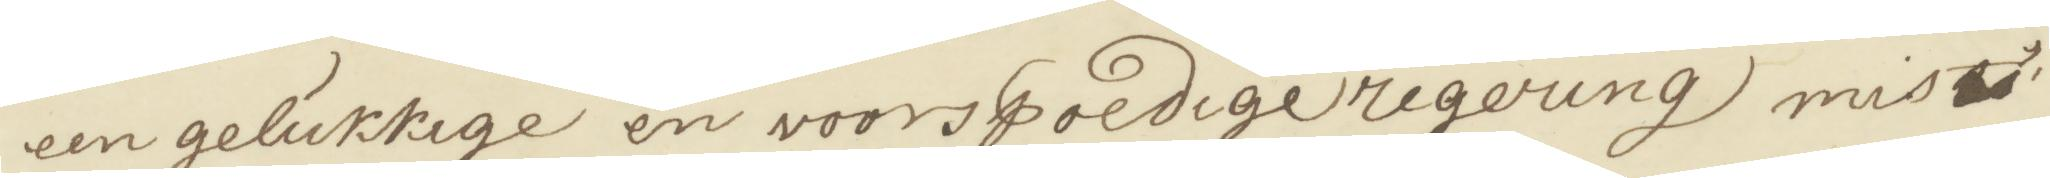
een gelukkige en voorspoedige regering mis ts's
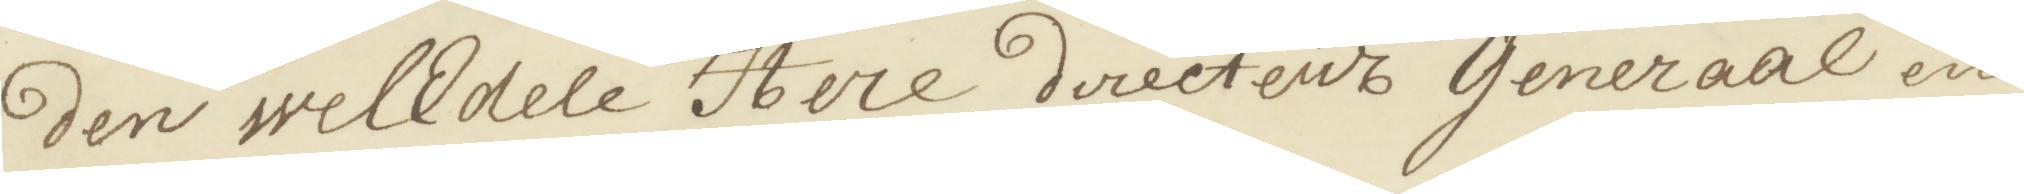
den welEdele Here directeur generaal en
